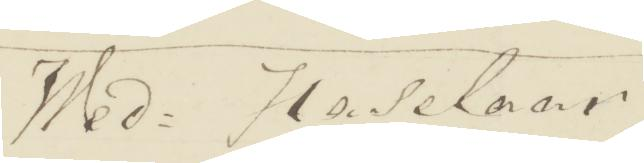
Wed: Haselaar
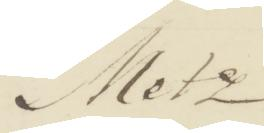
Metz
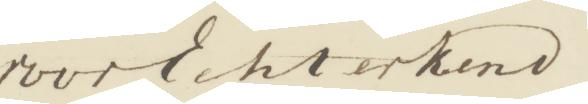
voor Echt erkend
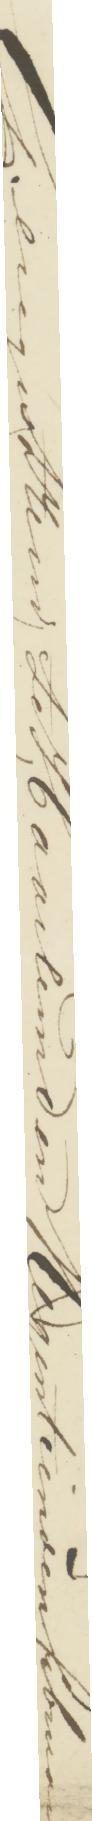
Geregistreerd te Haarlem den Negentienden February
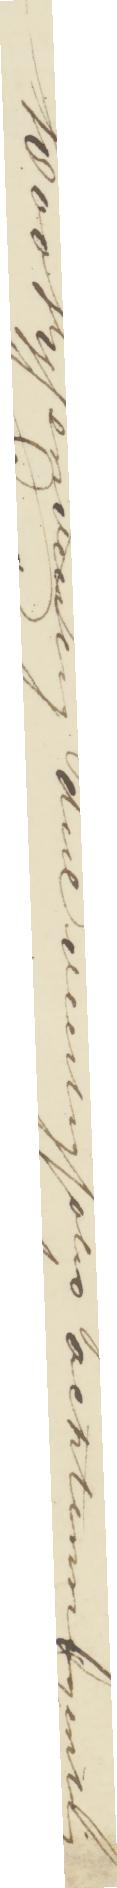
1800 Vijf enveertig deel veertig folio achtennegentig
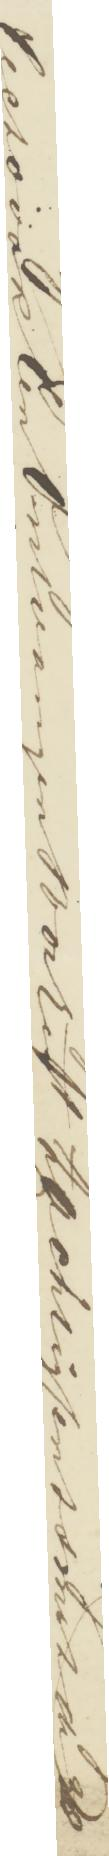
Recto vak Een Ontvangen voor Regt tachtig Cents met de 38
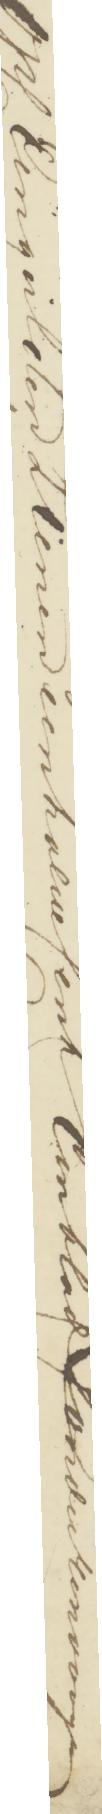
opC Eengulden tienen eenhalve Cent Een blad Zonder renvooyen
